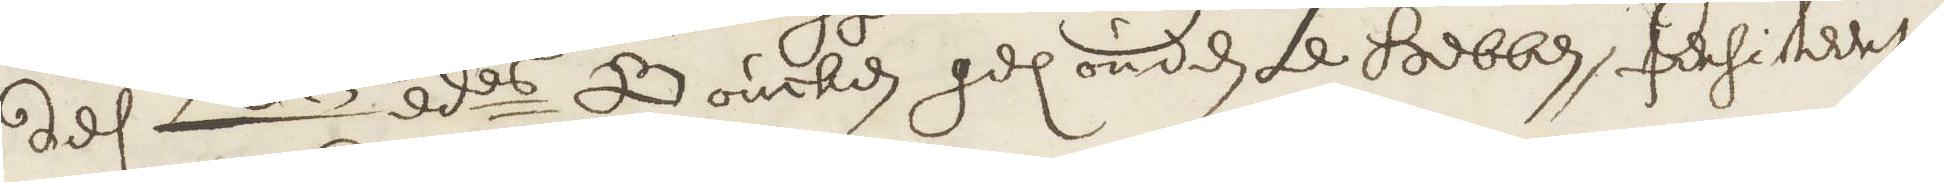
des Ged=es Boucken gehouden te hebben, persiteert
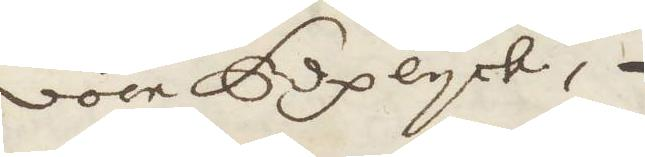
voor Replyck,
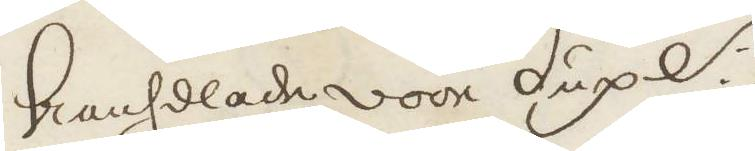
kanselaer voor duplijk
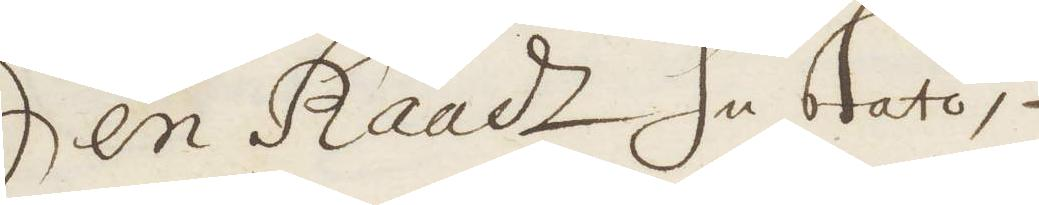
Den Raadt Jn stato,
